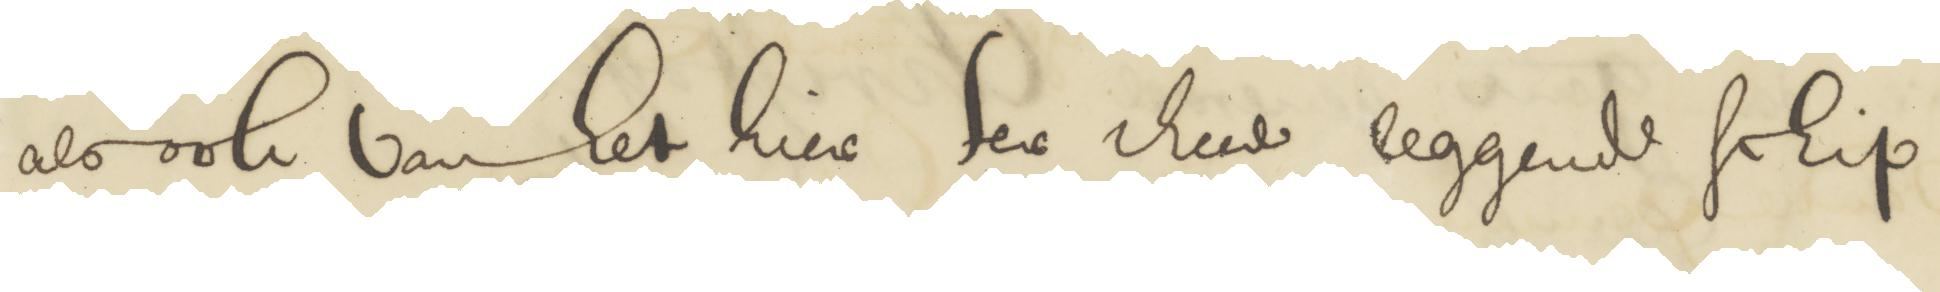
als ook van het hier ter rheede leggende schip
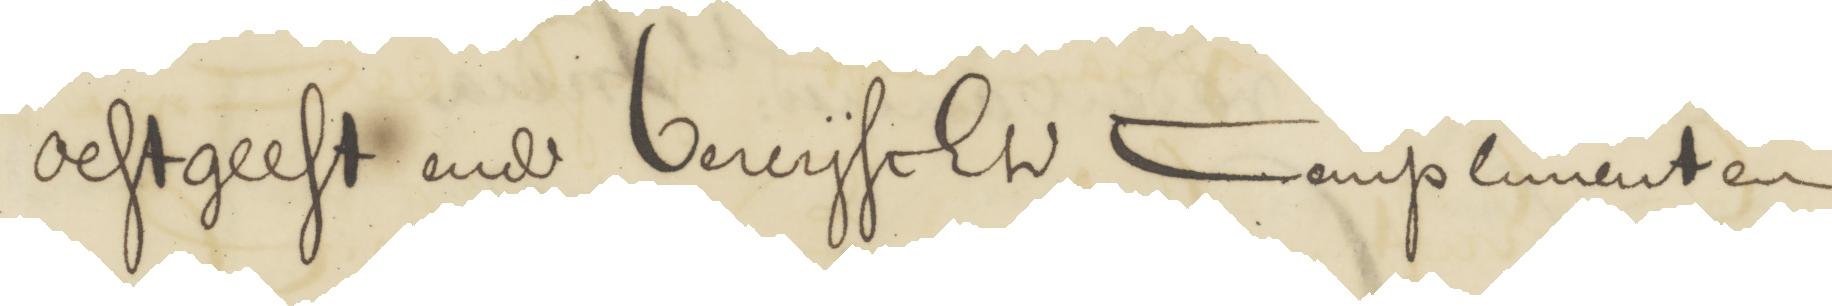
oestgeest ende vereijschte complimenten
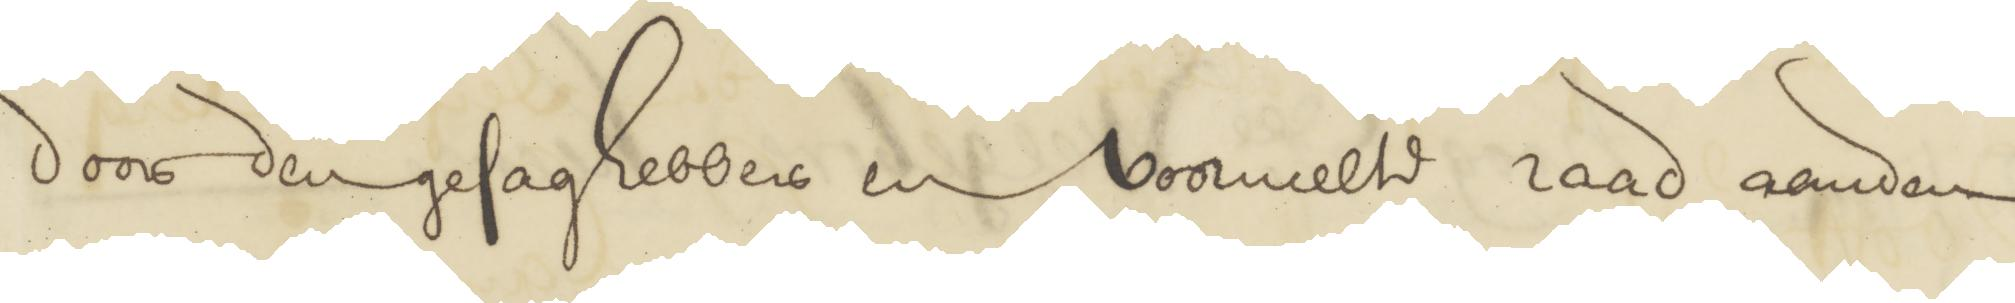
door den gesaghebber en voormelte raad aanden
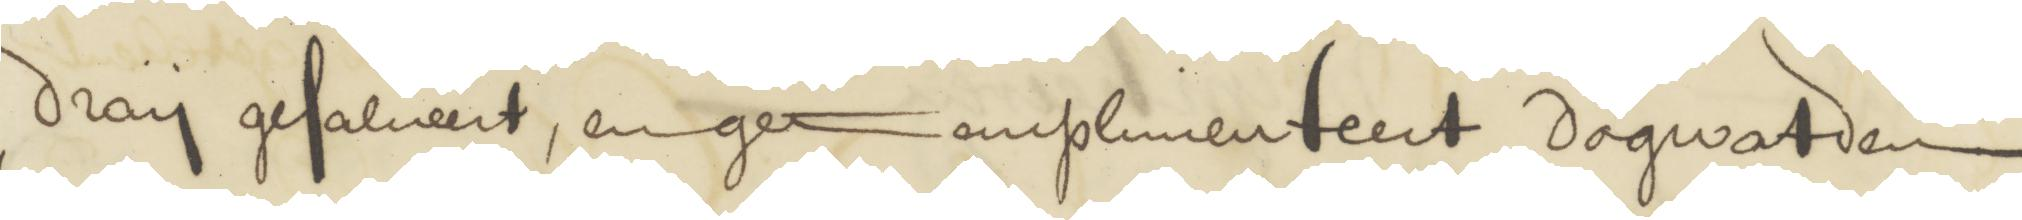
draij gesalueert, en gecomplimenteert dogwat den
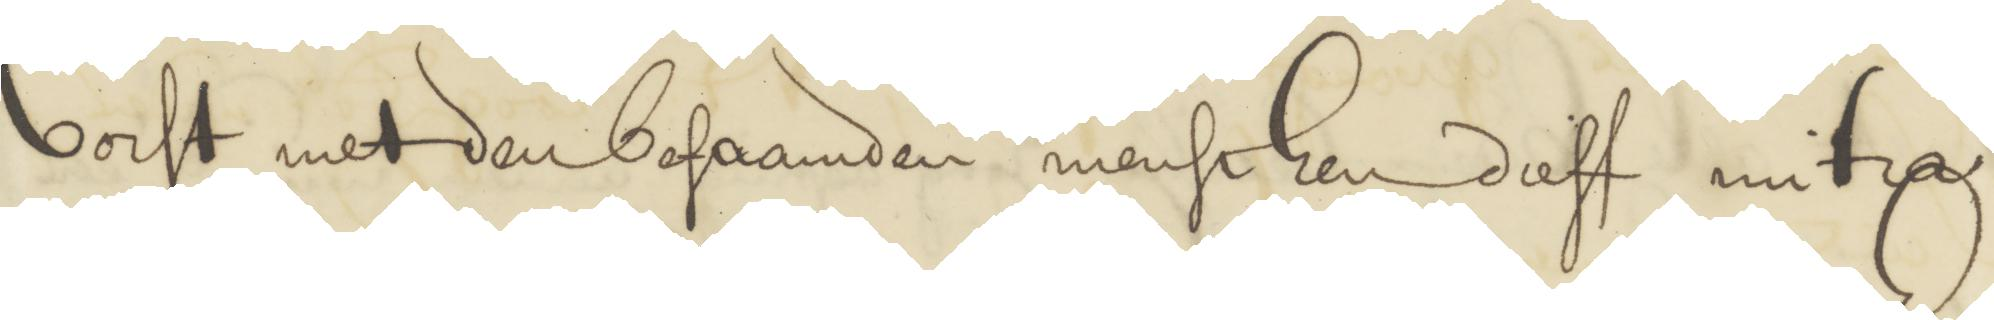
vorst met den befaamden menschen dieff mitra
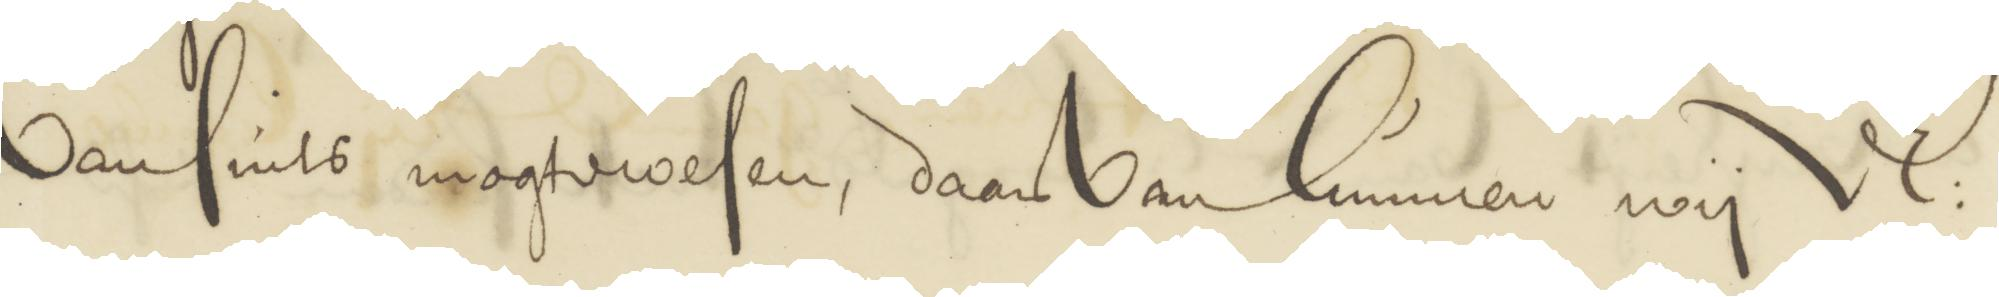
van sints mogtewesen, daar van kunnen wij VE:
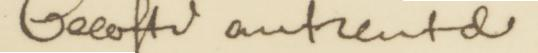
belofte ontrent de
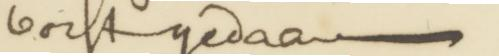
vorst gedaan
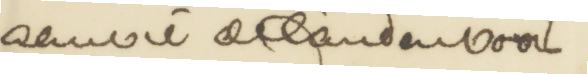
aan wie de landen voor
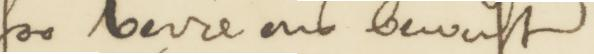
soo verre ons bewust
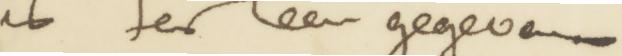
is ter leen gegeven
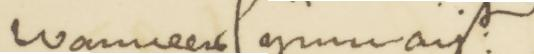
wanneer sijn maij:t
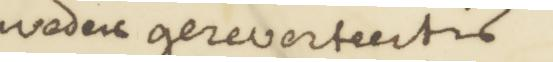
weder gereverteert is
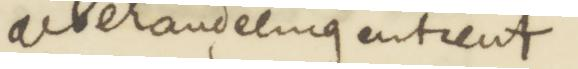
de behandeling ontrent
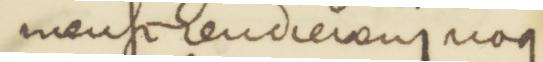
menschendieverij nog
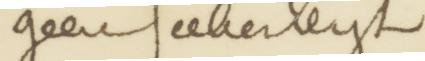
geen seekerheijt
